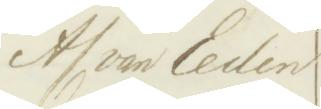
AC van Eeden
